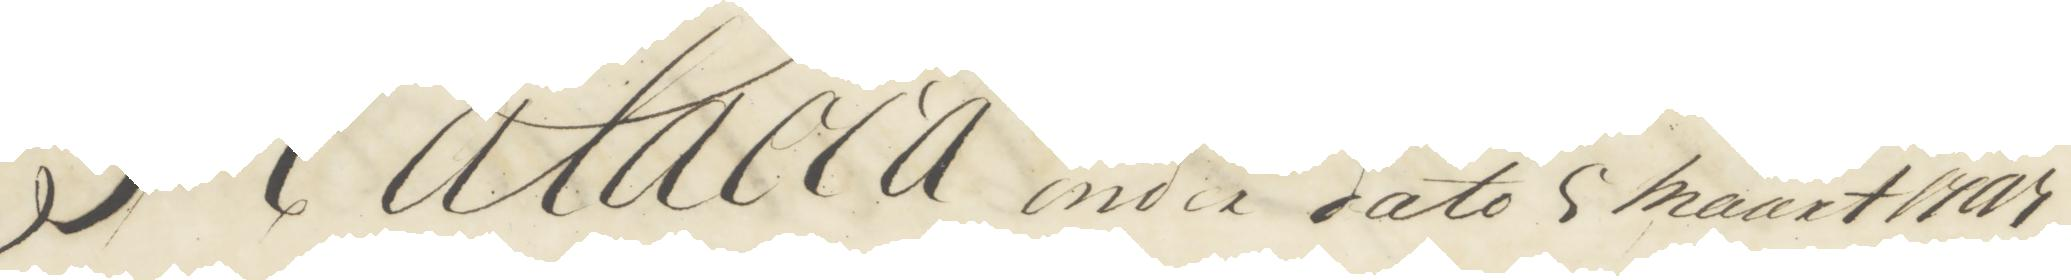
Van Malacca onder dato 5 maart 1747
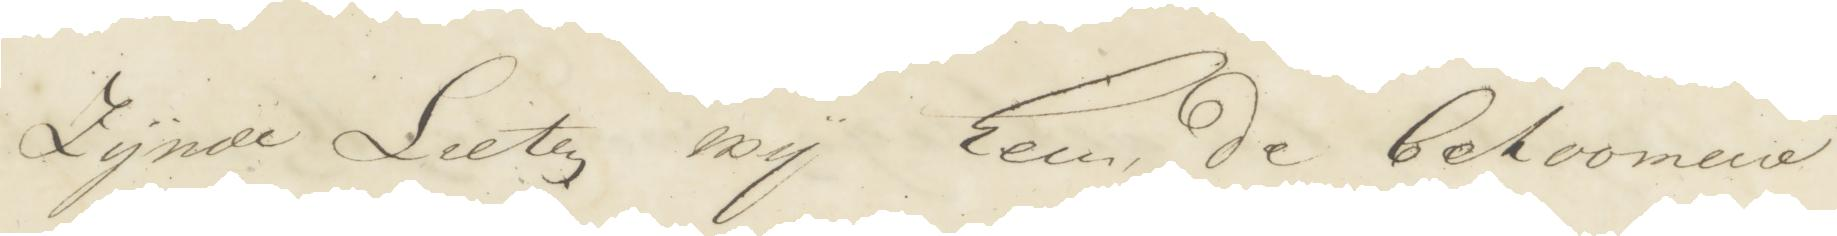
zijnde Lieten wij hem, de bekoomene
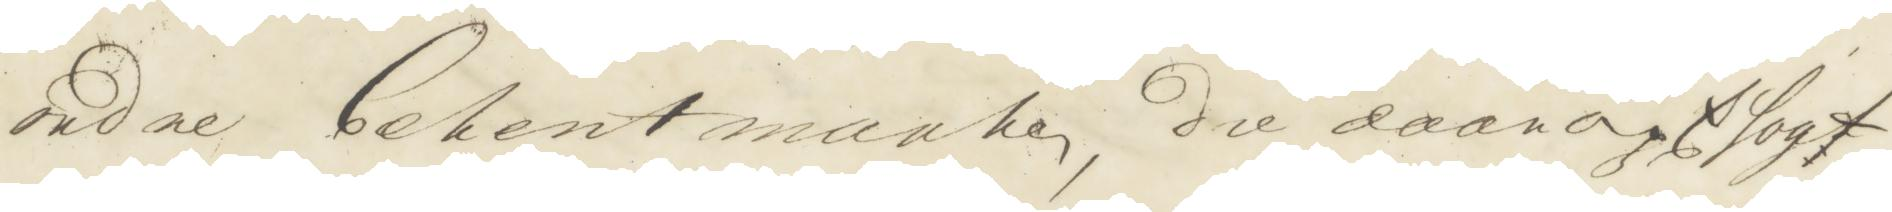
ordre bekent maaken, die daarop versogt
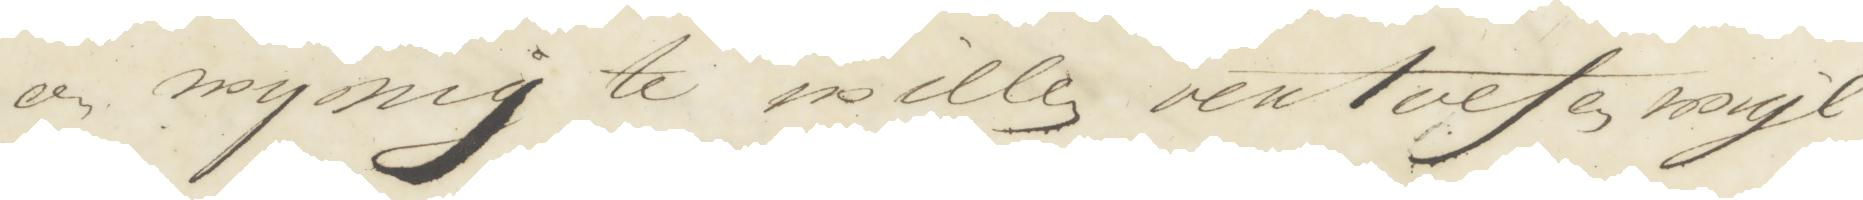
een wijnig te willen vertoefen wijl
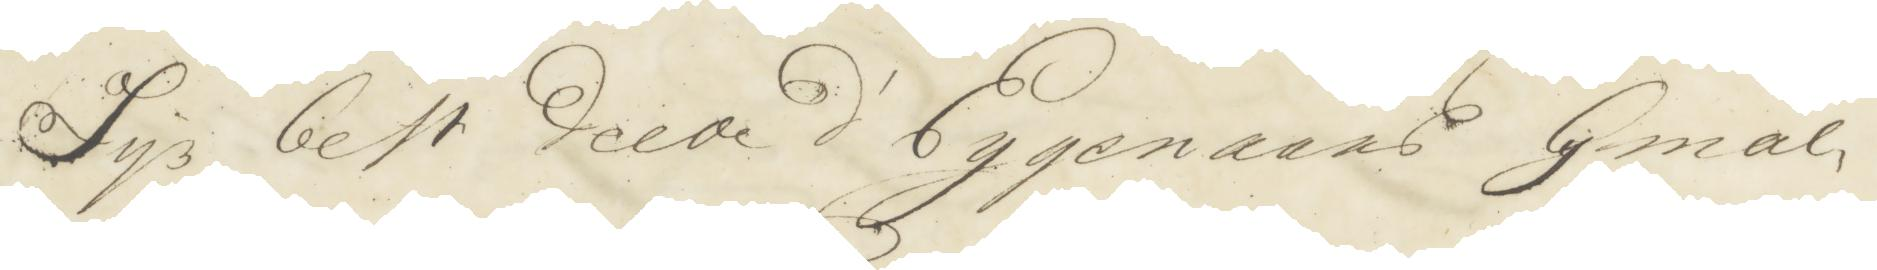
Sijn best deede d' Eygenaars bij mal,
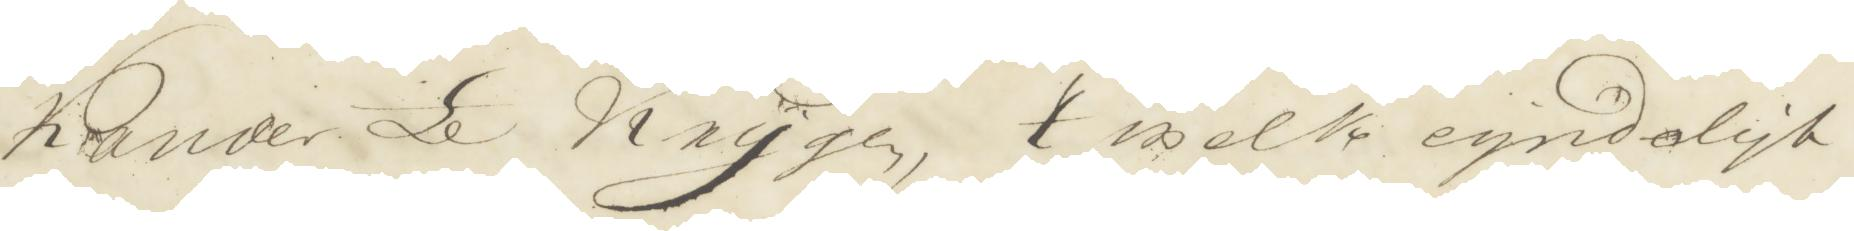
kander te krijgen, 't welk eijndelijk
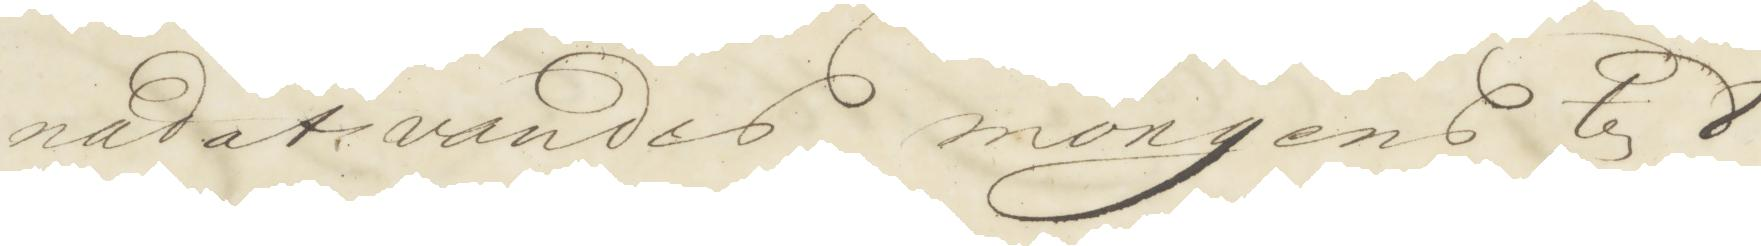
nadat van des morgens ten 8
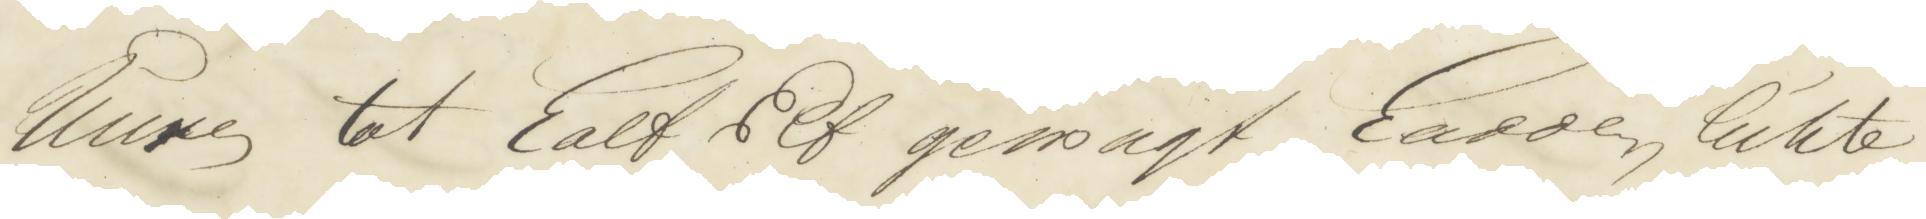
Uuren tot half Elf gewagt hadden lukte
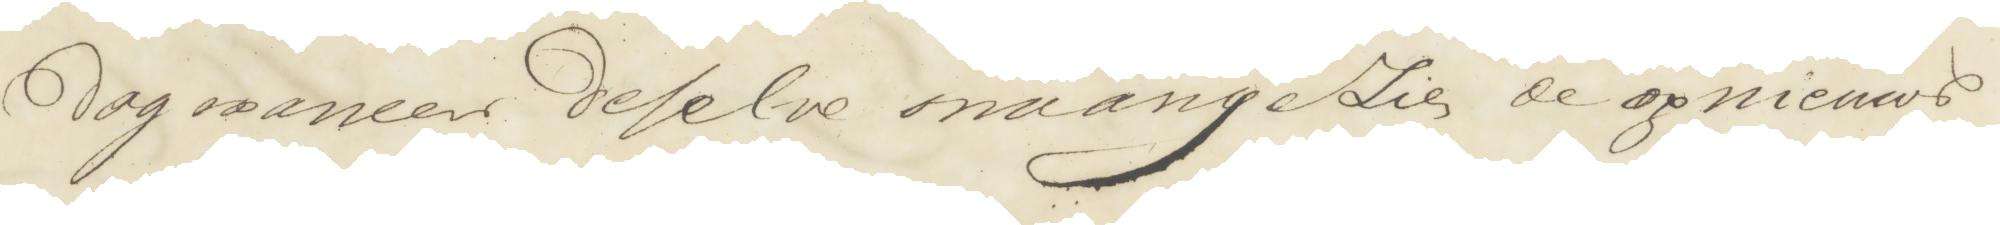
dog waneer deselve onaangezien de opnieuws
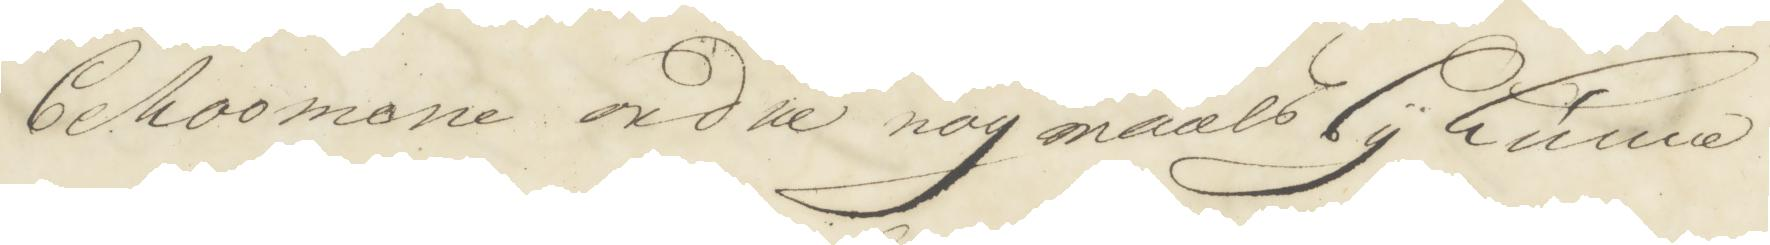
bekoomene ordre nog maals bij hunne
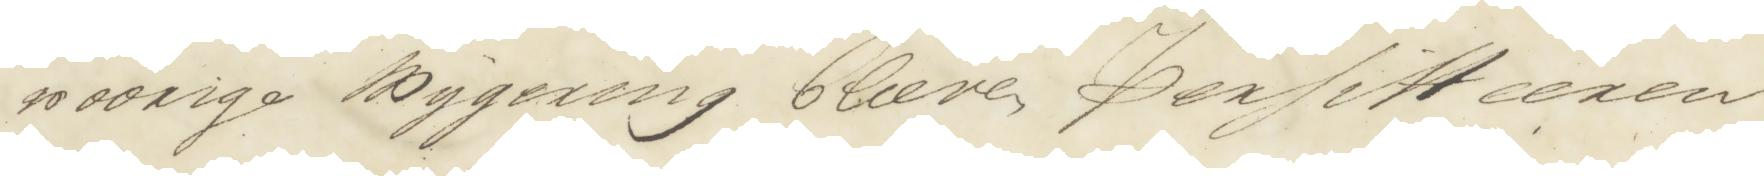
voorige wijgering bleeven persitteeren
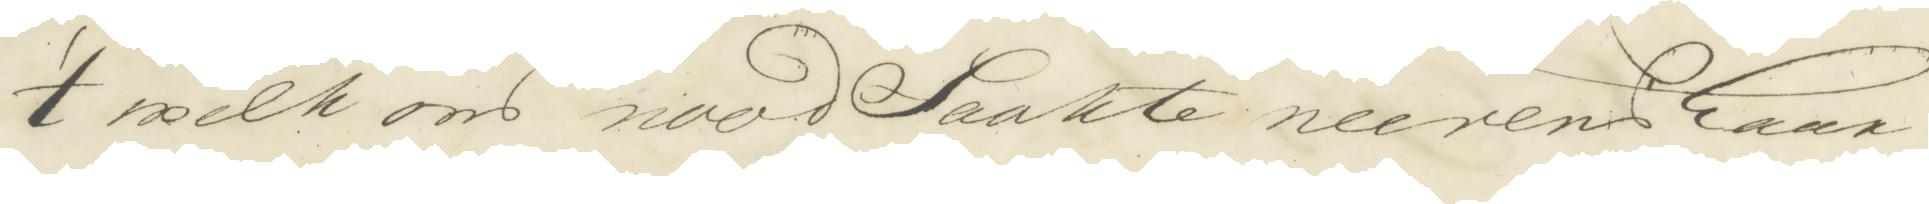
’t welk ons nood Saakte neevens haar
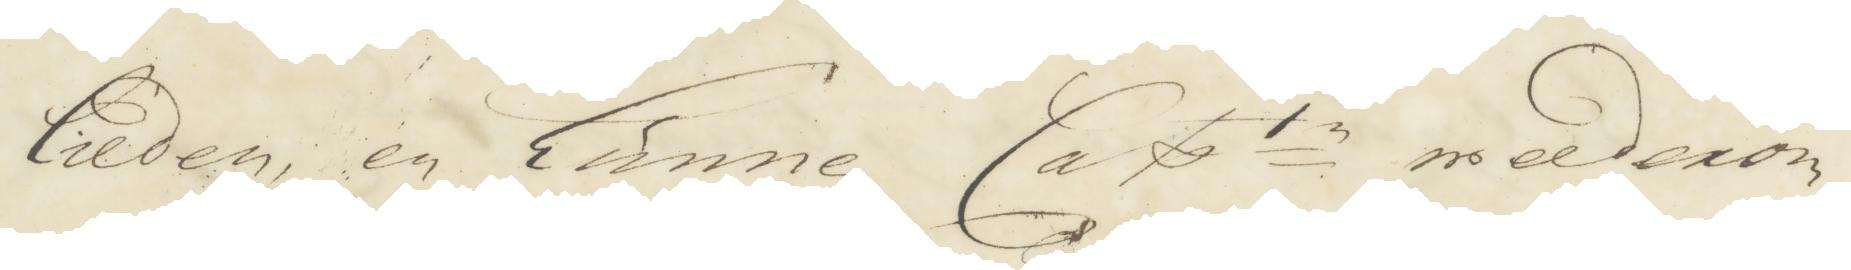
lieden, en hunne Cap=tn weederom
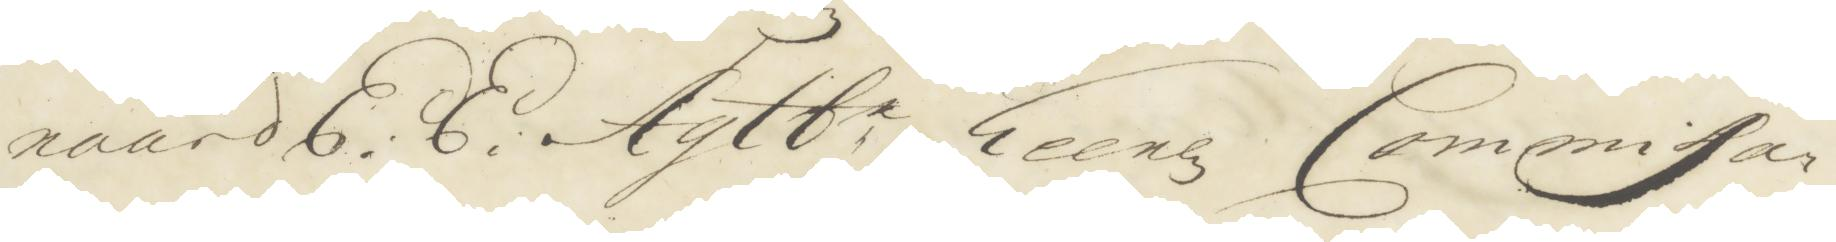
naar d' E: E: Agtb:r heeren Commissar
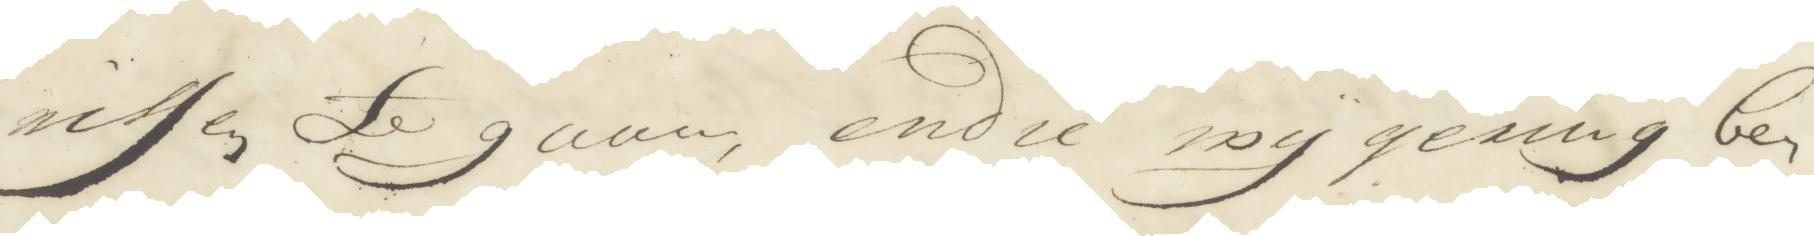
rissen te gaan, en die wij gering be,
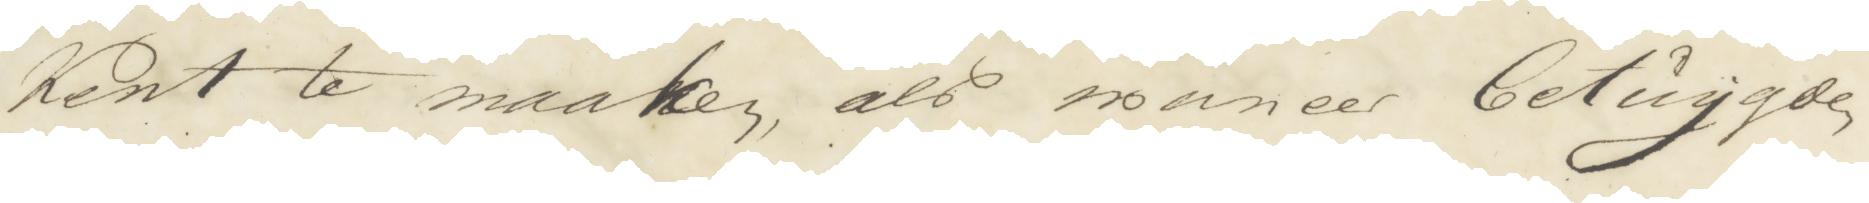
kent te maaken als waneer betuijgden
